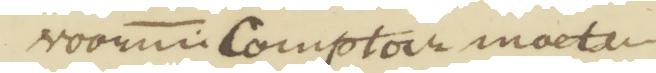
voorm: Comptoir moeten
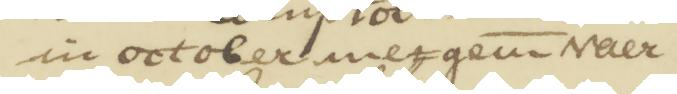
in october met gem vaer
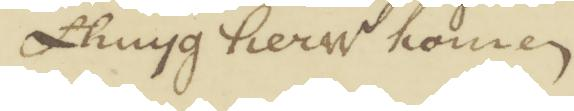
thuijg herws komen
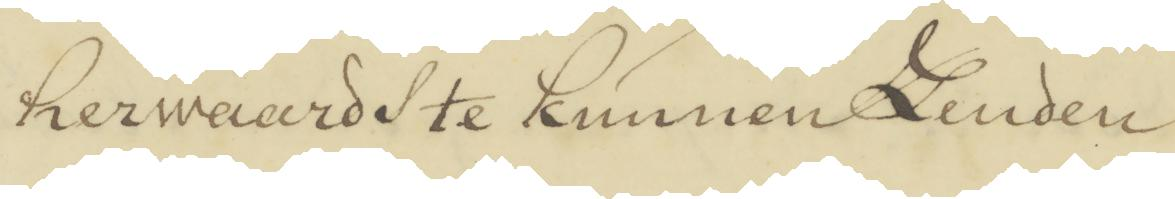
herwaards te kunnen zenden
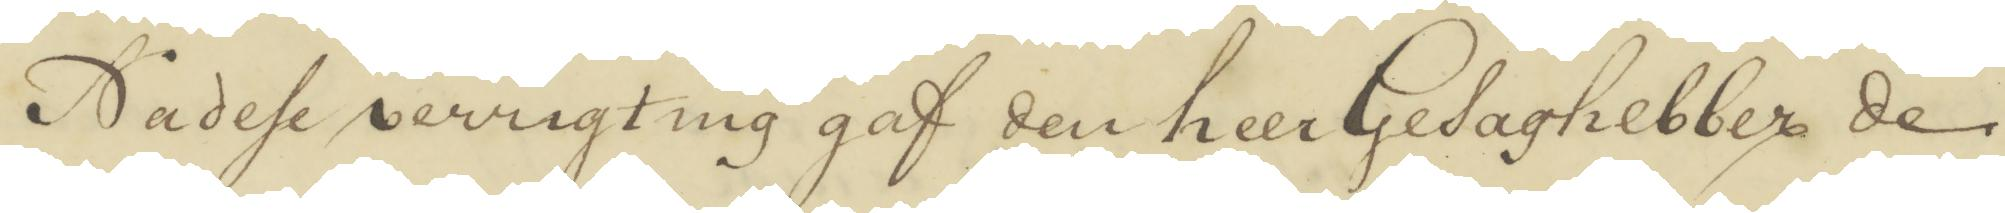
Na dese verrigting gaf den heer Gesaghebber de
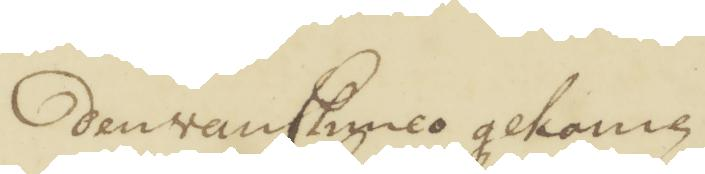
den van Chinco gekomen
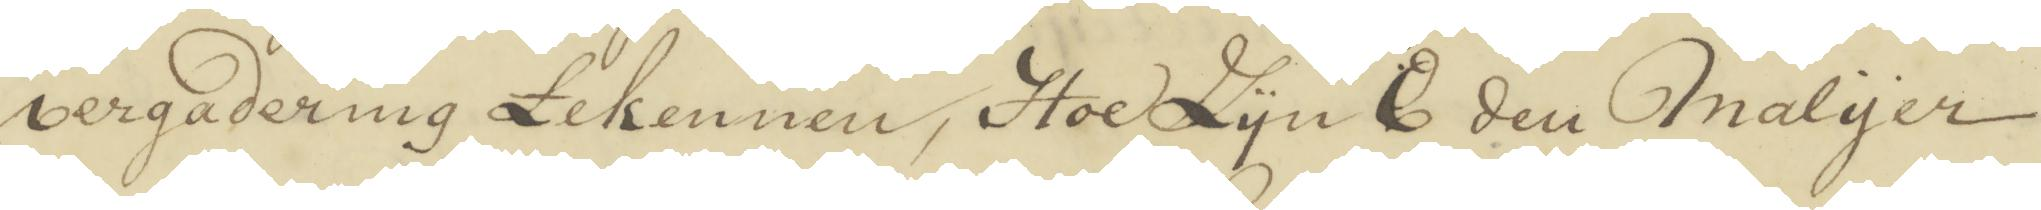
vergadering tekennen, Hoe zijn E den malijer
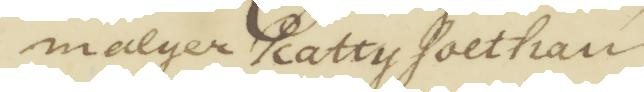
malyer katty soethan
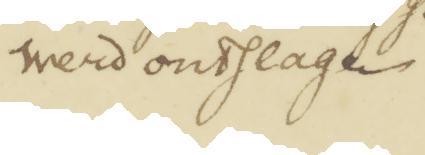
werd ontslagen.
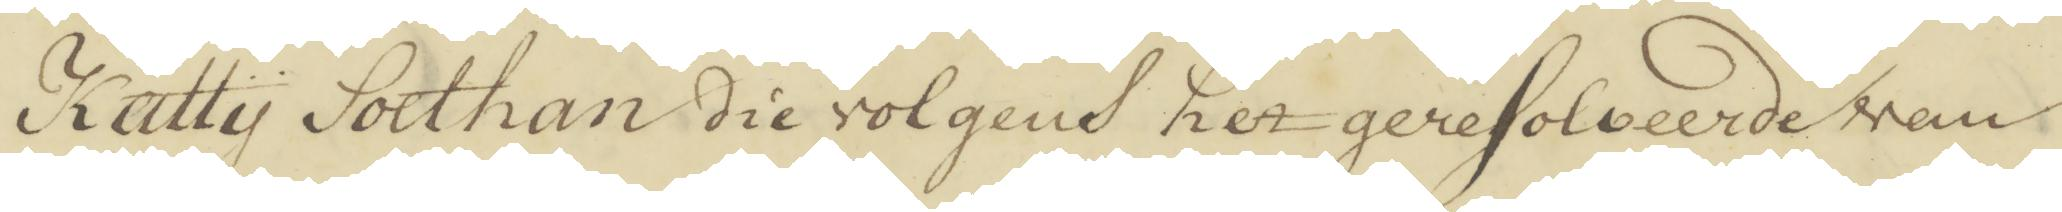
Kattij soethan die volgens het geresolveerde van
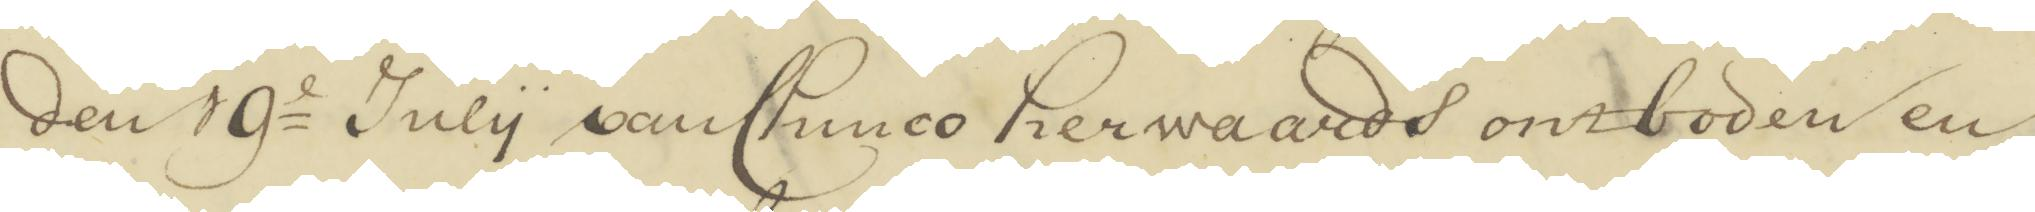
den 19=e Iulij van Chinco herwaards ontboden en
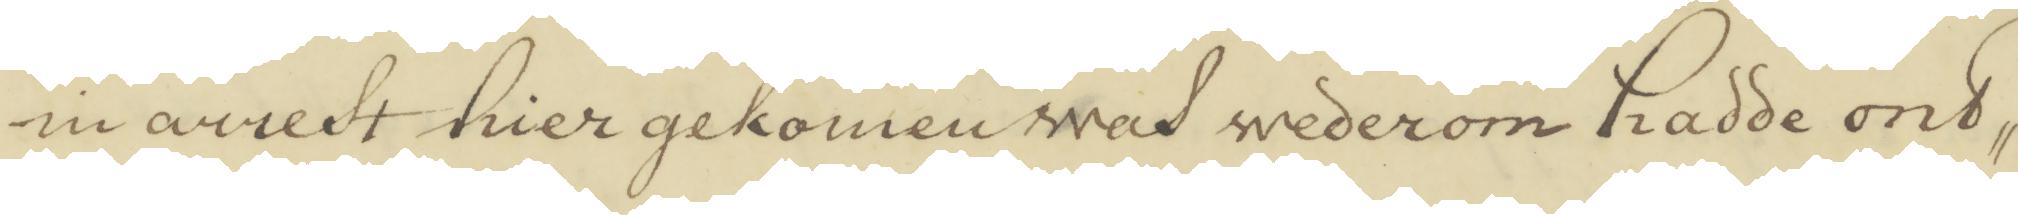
in arrest hier gekomen was wederom hadde ond„
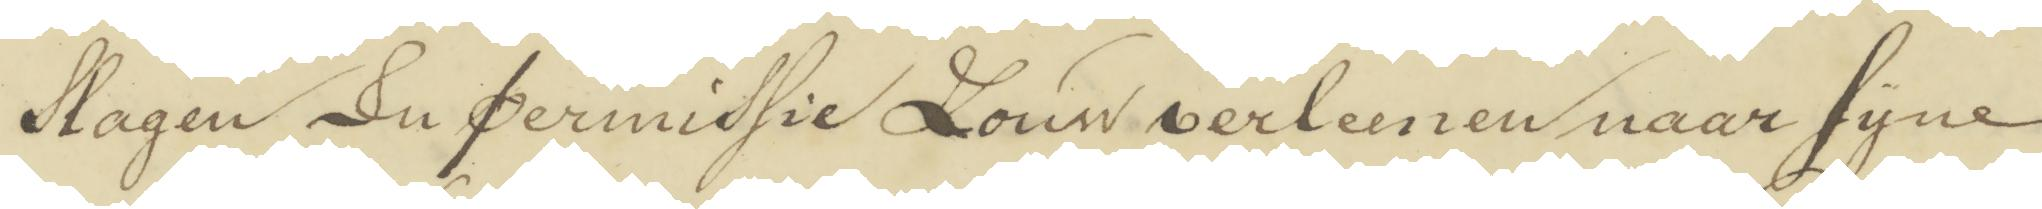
slagen en permissie zouw verleenen naar sijne
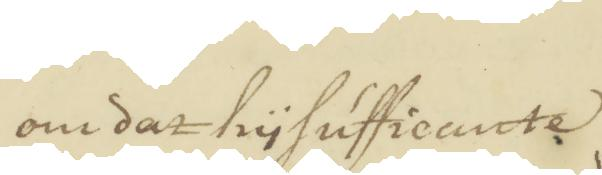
om dat hij sufficante
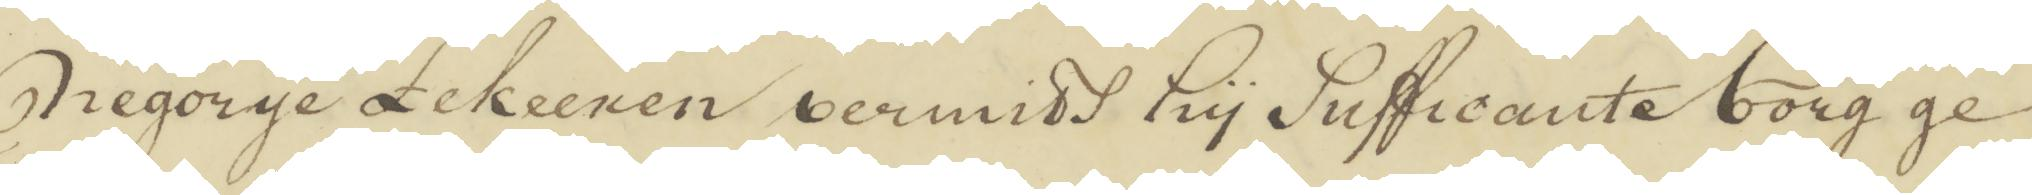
negorije te keeren vermids hij sufficante borg ge
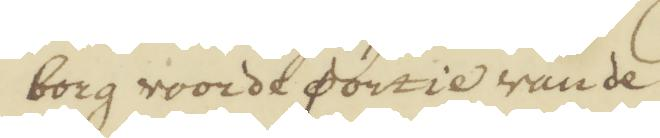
borg voor de portie van de
